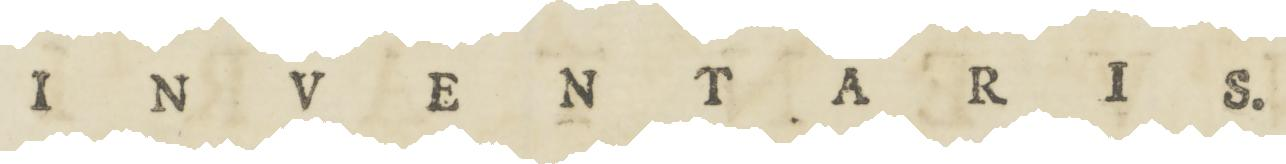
INVENTARIS.
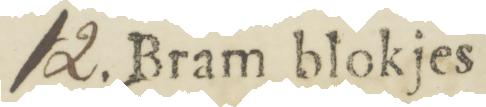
12. Bram blokjes
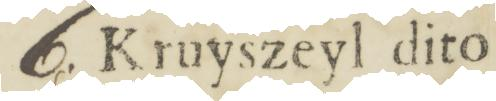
6. Kruyszeyl dito
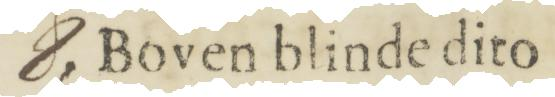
8. Boven blinde dito
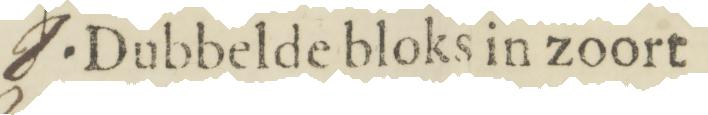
8. Dubbelde bloks in zoort
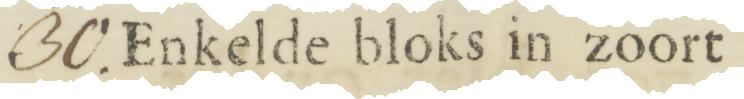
30. Enkelde bloks in zoort
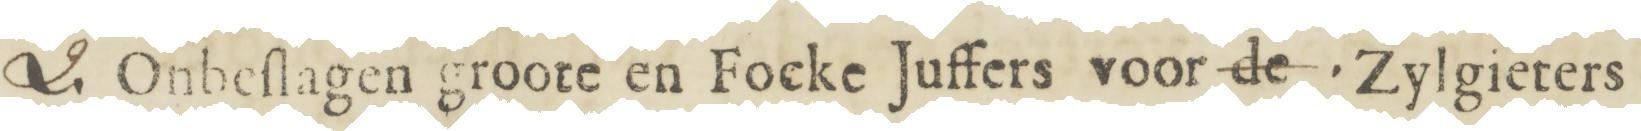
2. Onbeslagen groote en Focke Juffers voor de -.Zylgieters
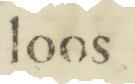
loos
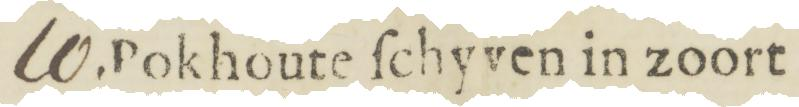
10. Pokhoute schyven in zoort
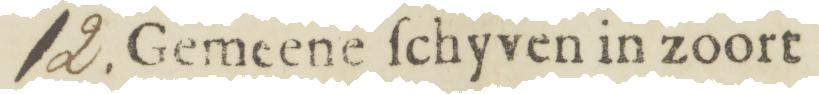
12. Gemeene schyven in zoort
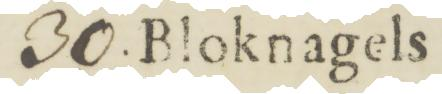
30. Bloknagels
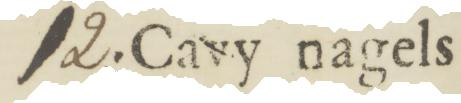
12. Cavy nagels
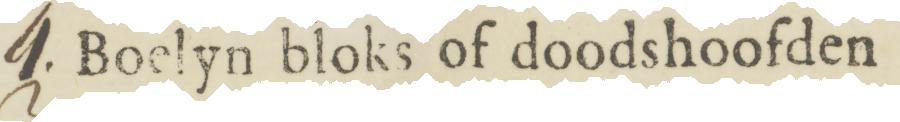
4. Boelyn bloks of doodshoofden
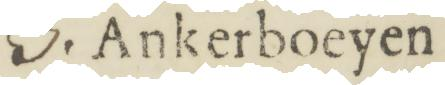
3. Ankerboeyen
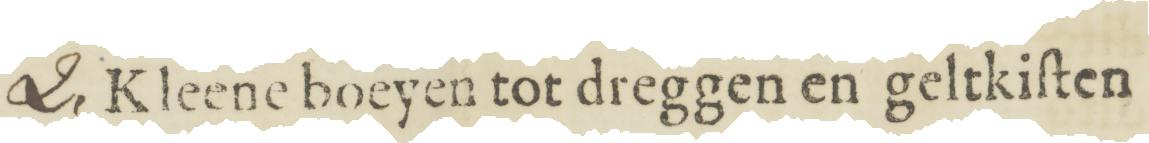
2. Kleene boeyen tot dreggen en geltkisten
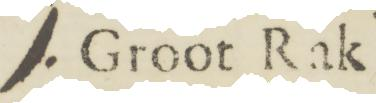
1. Groot Rak
